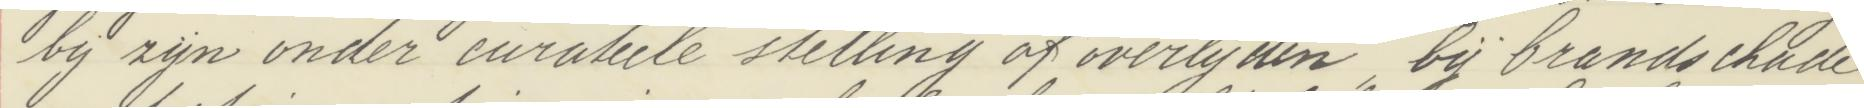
bij zijn onder curateele stelling of overlijden bij brandschade
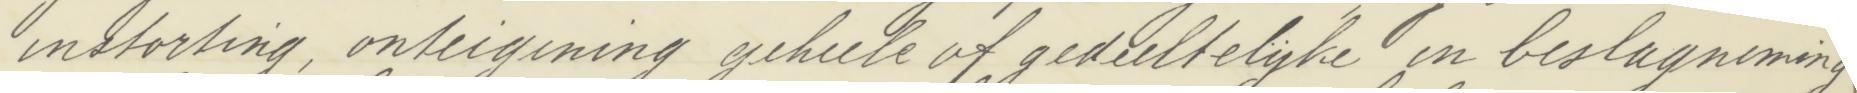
instorting, onteigening geheele of gedeeltelijke in beslagneming
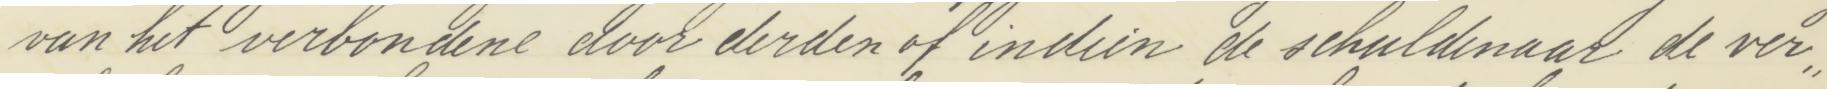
van het verbondene door derden of indien de schuldenaar de ver
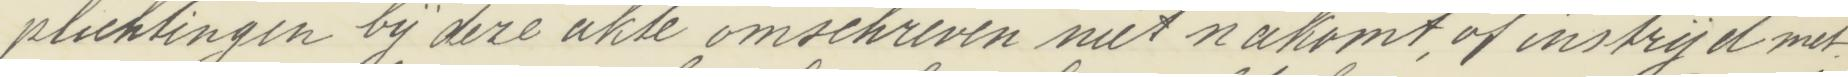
plichtingen bij deze akte omschreven niet nakomt, of instrijd met
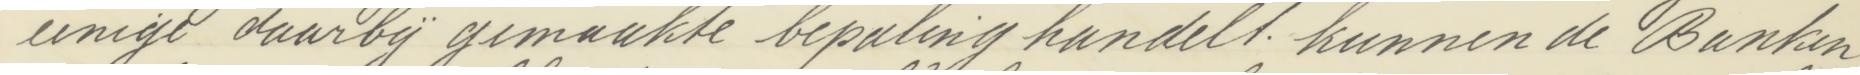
eenige daarbij gemaakte bepaling handelt kunnen de Banken
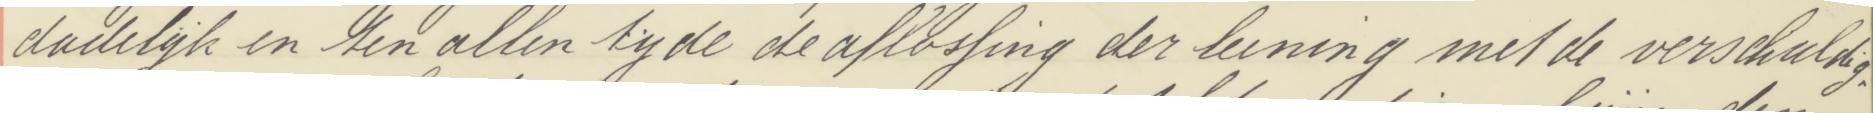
dadelijk en ten allen tijde de aflossing der leening met de verschuldig„
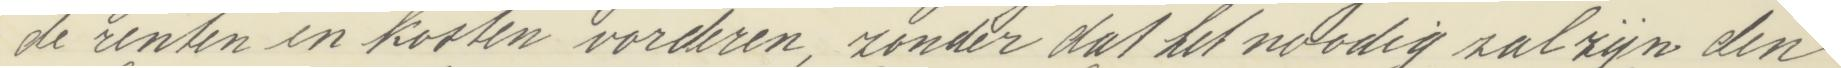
de renten en kosten vorderen, zonder dat het noodig zal zijn den
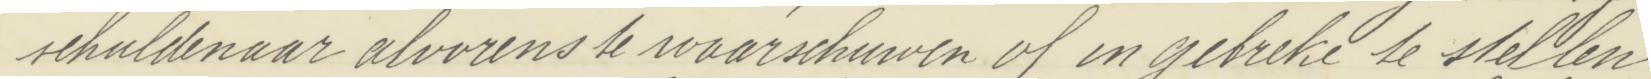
schuldenaar alvorens te waarschuwen of in gebreke te stellen
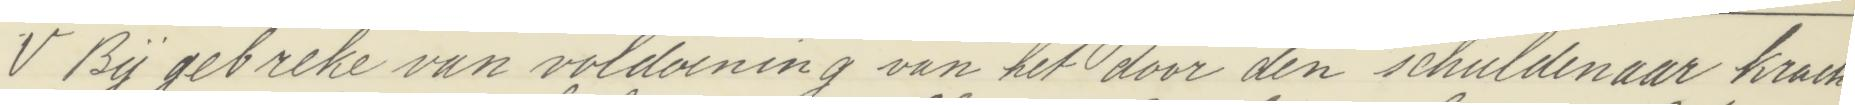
V Bij gebreke van voldoening van het door den schuldenaar krach
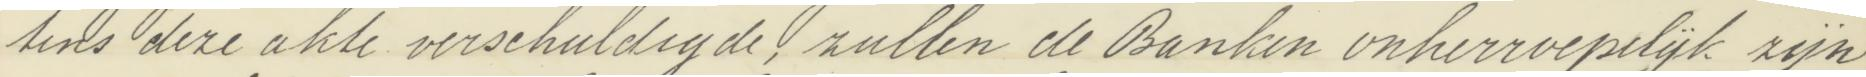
tens deze akte verschuldigde, zullen de Banken onherroepelijk zijn
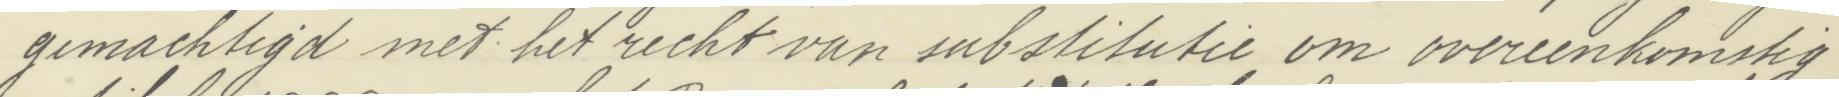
gemachtigd met het recht van substitutie om overeenkomstig
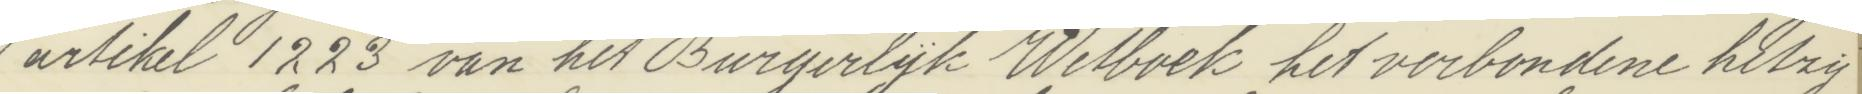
artikel 1223 van het Burgerlijk Wetboek het verbondene hetzij
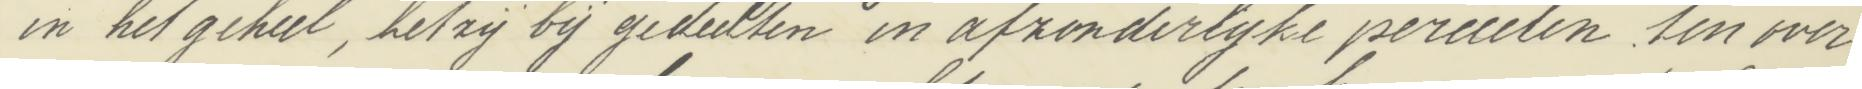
in het geheel, het zij bij gedeelten in afzonderlyke perceelen, ten over
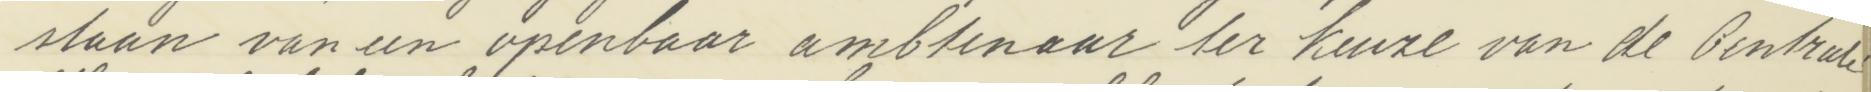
staan van een openbaar ambtenaar ter keuze van de Centrale
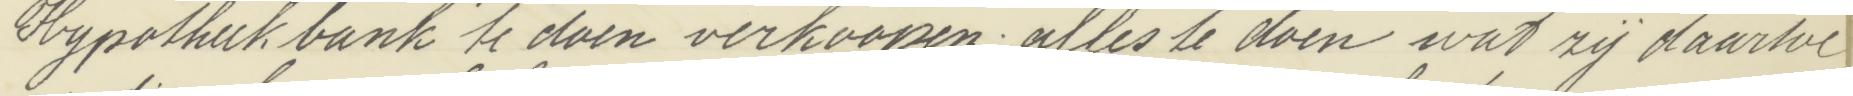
Hypotheekbank te doen verkoopen; alles te doen wat zij daartoe
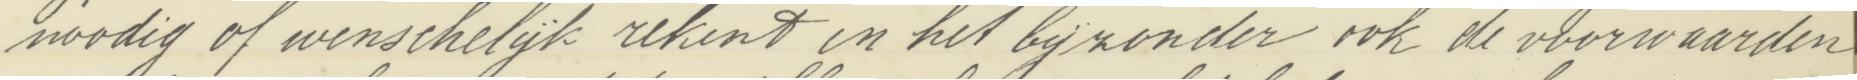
noodig of wenschelijk rekent in het bijzonder ook de voorwaarden
